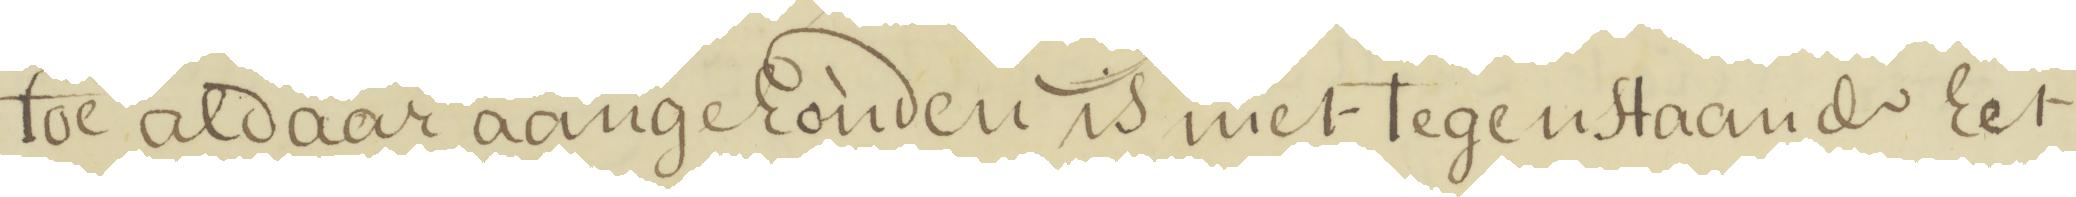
toe aldaar aangehouden is niet tegenstaande het
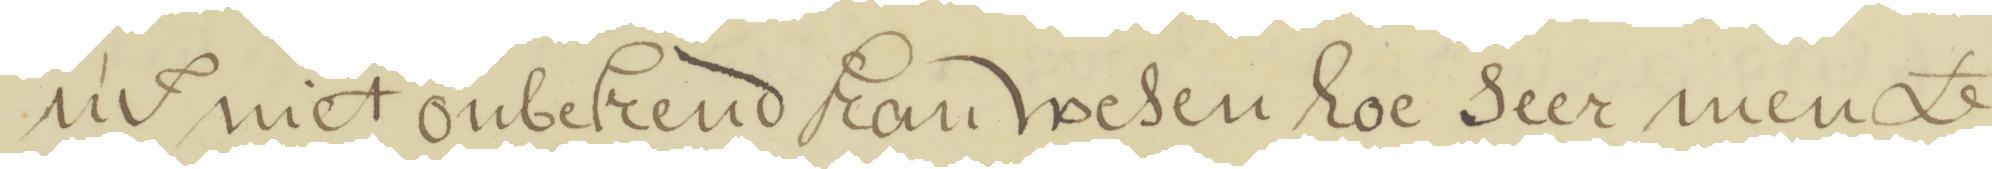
uE niet onbekend kan wesen hoe seer men te
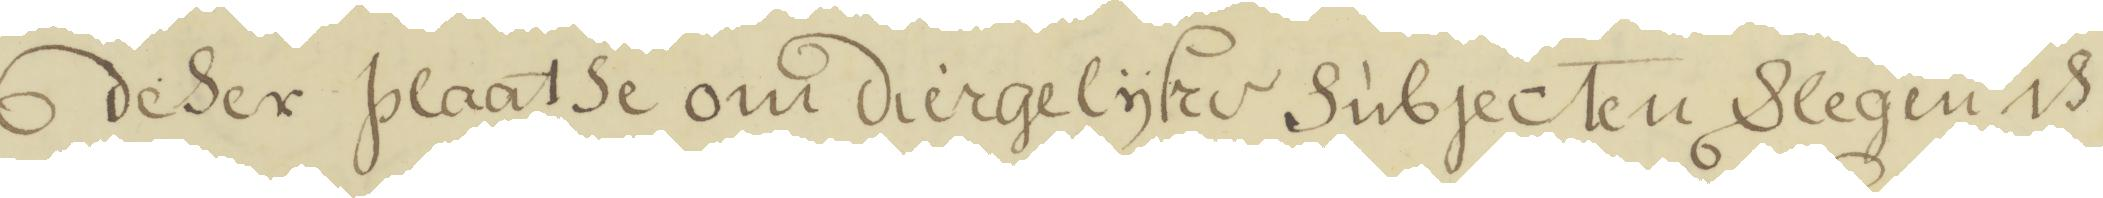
deser plaatse om diergelijke subjecten verlegen is
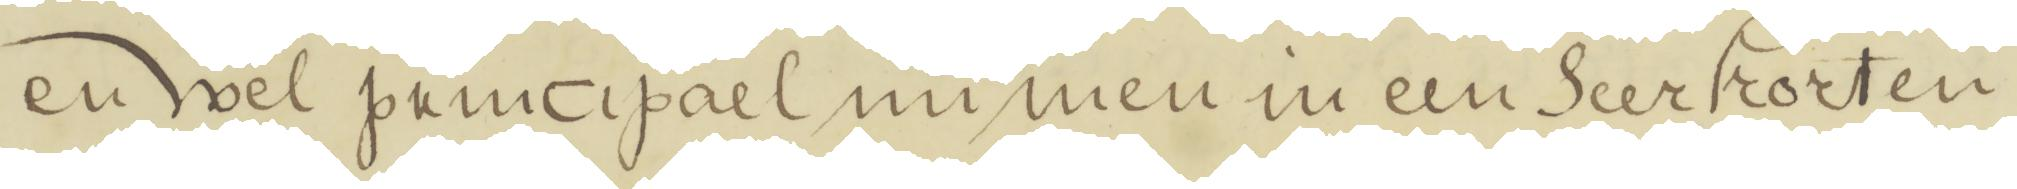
en wel principael nu men in een seer korten
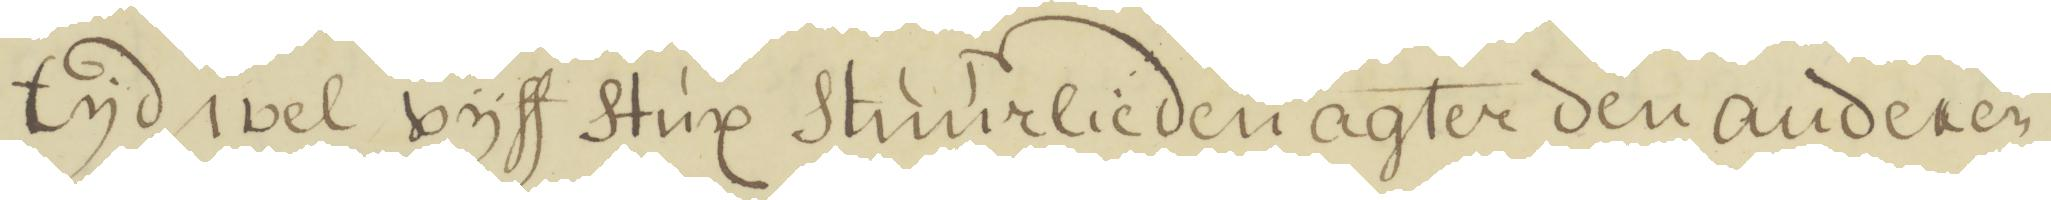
tijd wel vijff stux stuurlieden agter den anderen
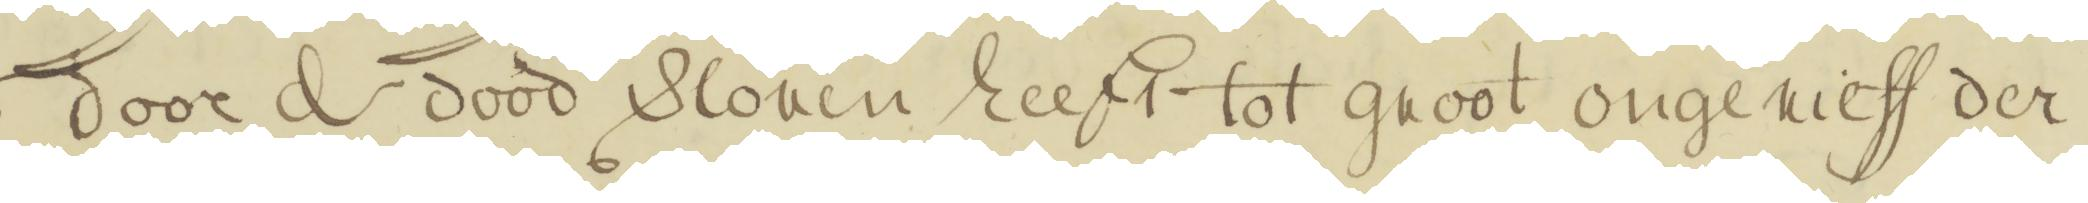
door de dood verloren heeft tot groot ongerieff der
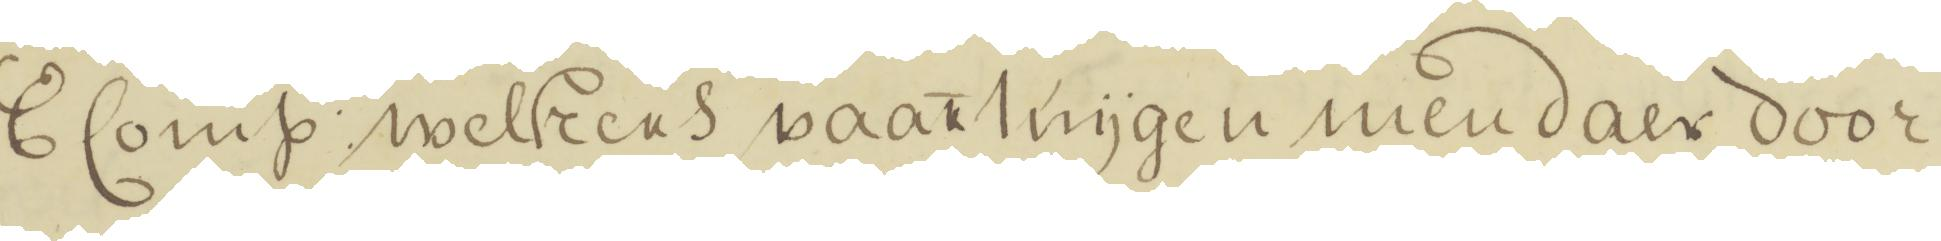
E Comp: welkers vaartuijgen men daer door
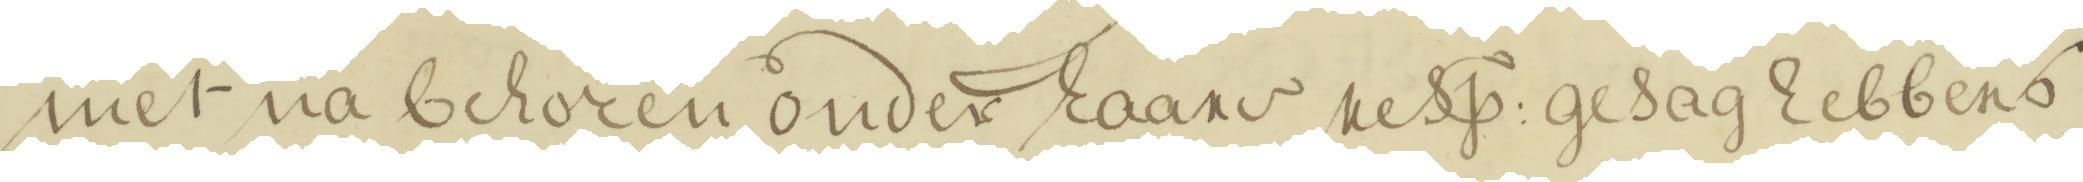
met na behoren onder haare resp: gesaghebbers
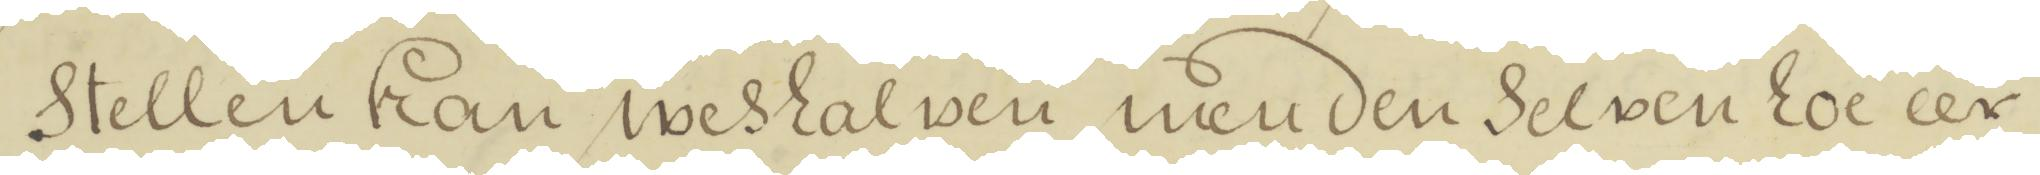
Stellen kan weshalven men den Selven hoe eer
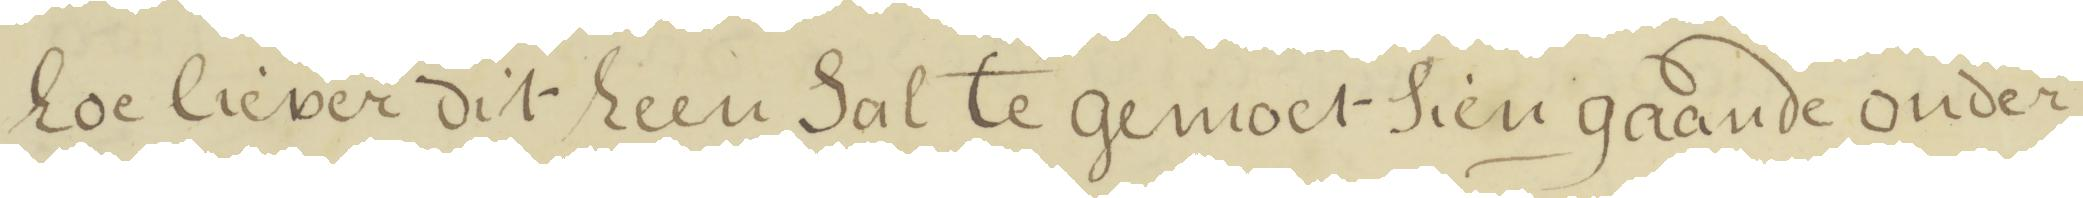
hoe liever dit heen Sal te gemoet Sien gaande onder
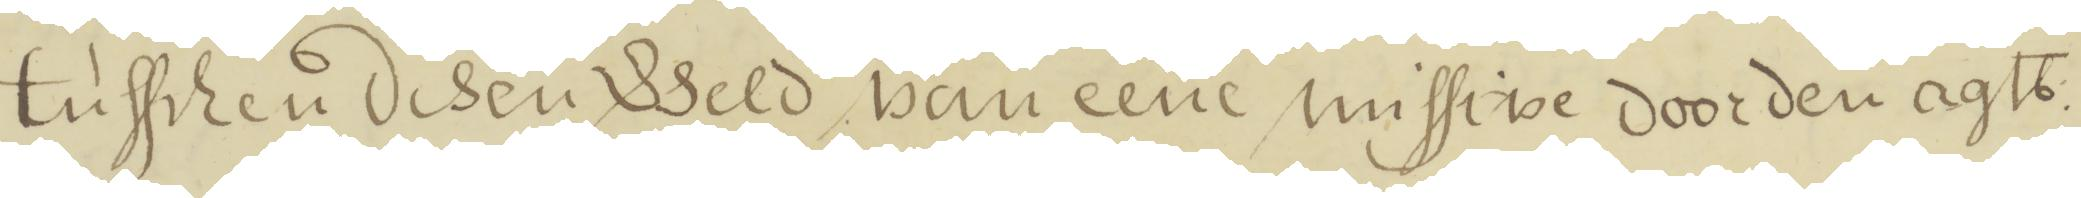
tusschen desen verseld, van eene missive door den agtb.
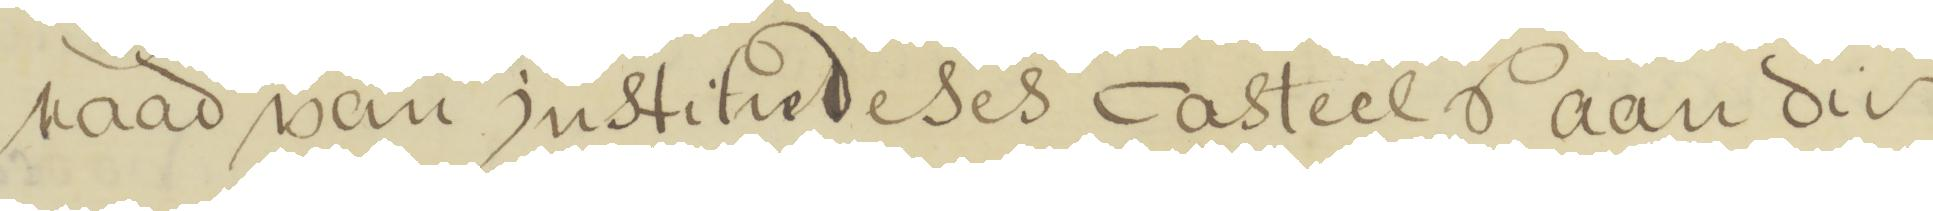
raad van justitie deses casteels aan die
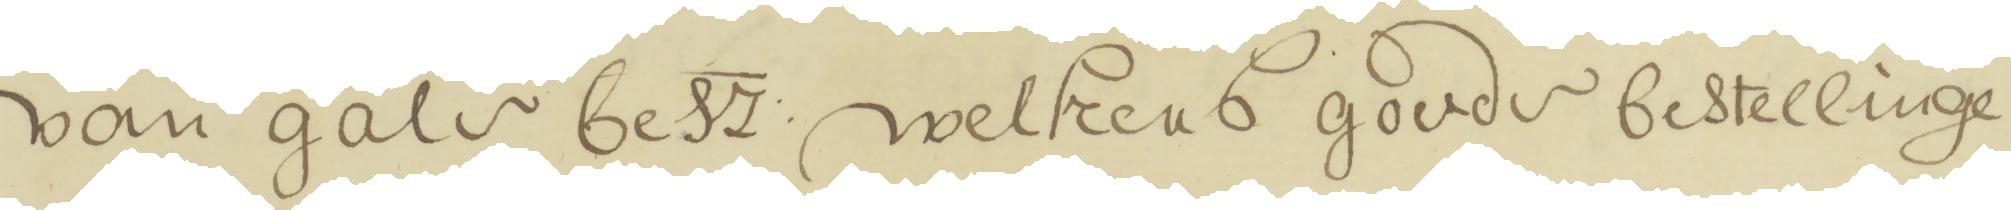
van gale besz: welkers goede bestellinge
